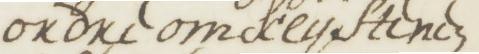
ordre om keijstenen
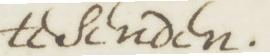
te senden.
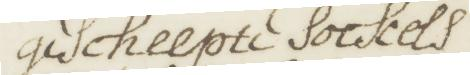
gescheepte sockels
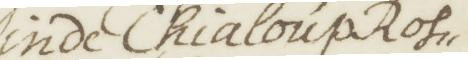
in de Chialoup Ros„
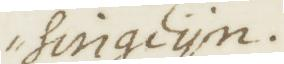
„singeijn.
